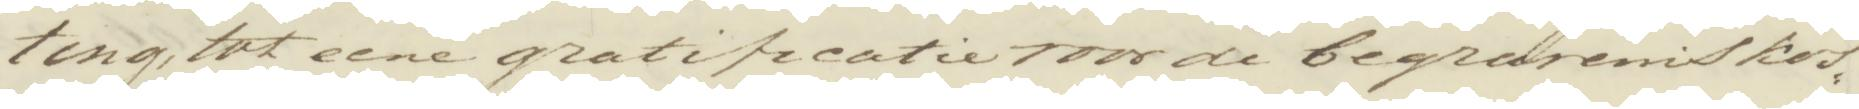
ting, tot eene gratificatie voor de begravenis kos„
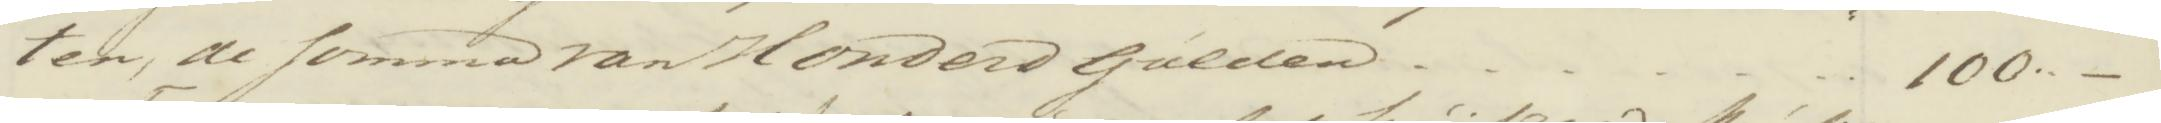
ten, de somma van Honderd Gulden. . . . . . . 100. -
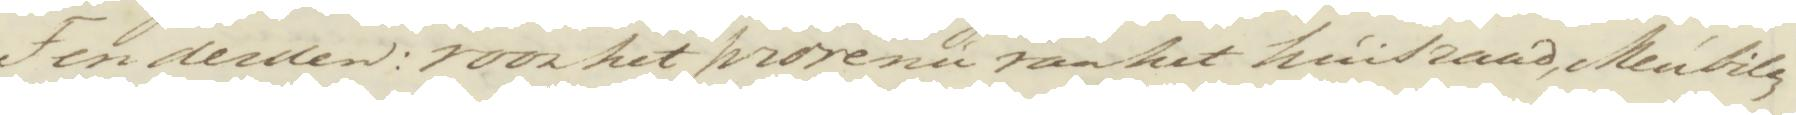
Ten derden: voor het provenu van het huisraad, Meubilen
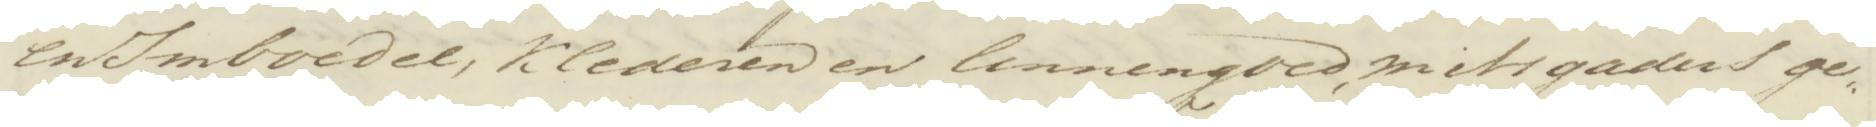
en Imboedel, Klederen en linnengoed, mitsgaders ge„
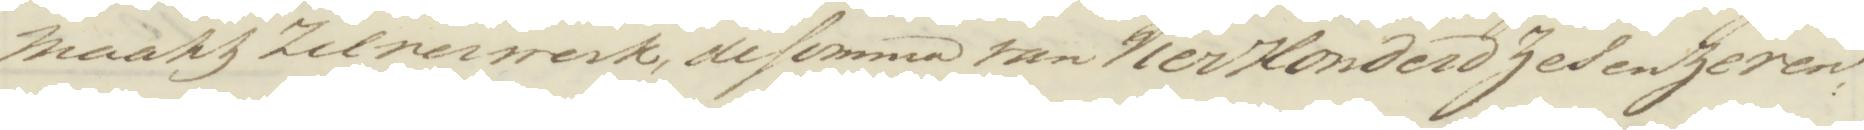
maakt Zilverwerk, de Somma van Vier Honderd Zes enZeven,
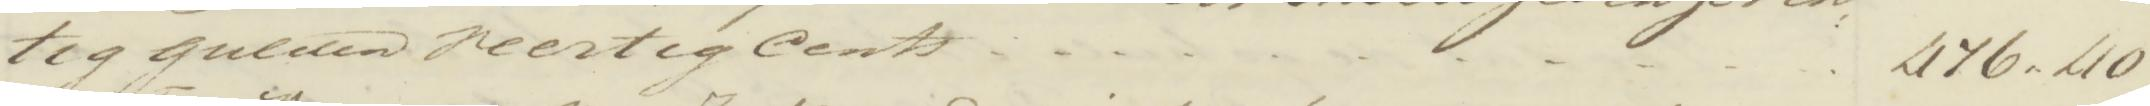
tig gulden veertig Cents . . . . . . . . . . . 476. 40
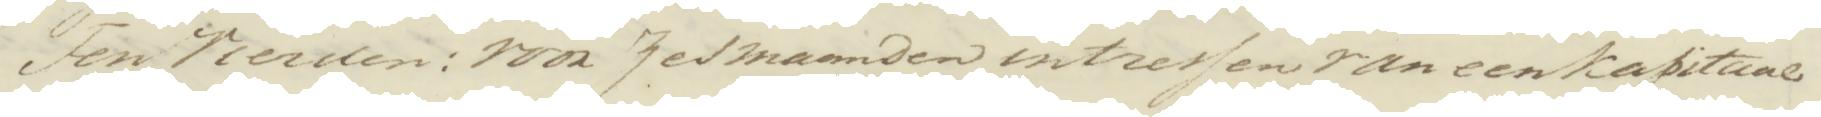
ten Vierden: voor Zes maanden intressen van een kapitaal
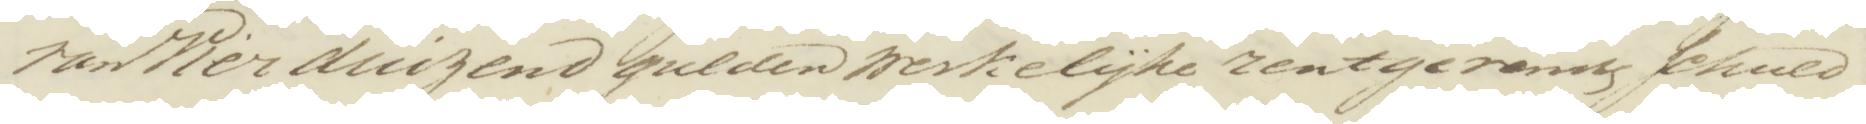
van Vier duizend gulden werkelijke rentgevende Schuld
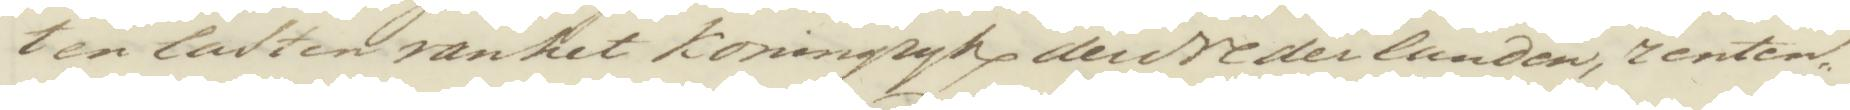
ten lasten van het koningryk der Nederlanden, renten„
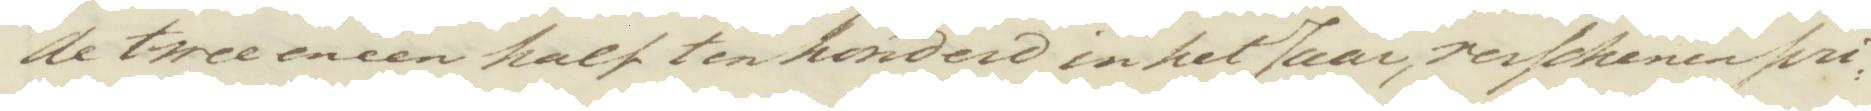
de twee en een half ten honderd in het Jaar, verschenen pri„
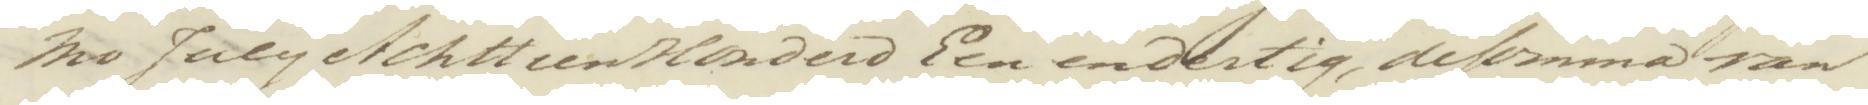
mo July Achttien Honderd Een en dertig, de Somma van
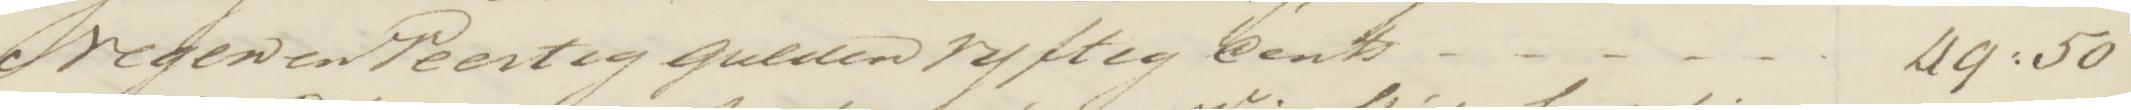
Negen en Veertig gulden vyftig Cents - - - - - - 49: 50
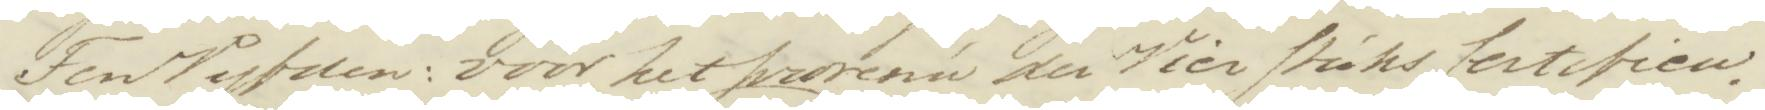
Ten Vyfden: voor het provinu der Vier stuks Certifica„
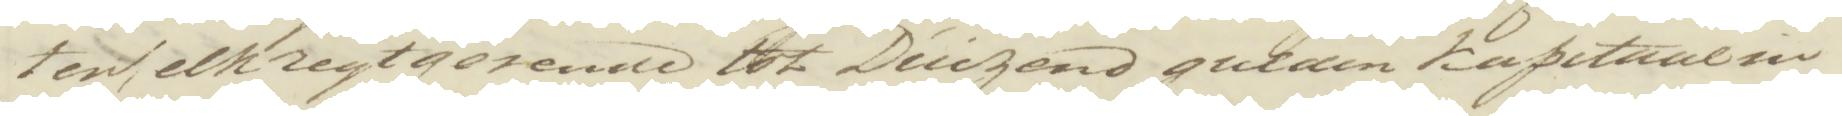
ten elk regtgevende tot Duizend gulden Kapitaal in
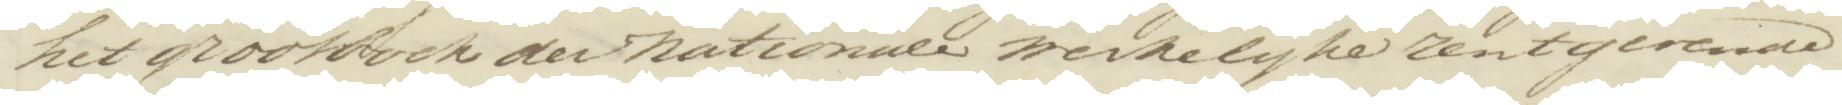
het grootboek der Nationale werkelyke rentgevende
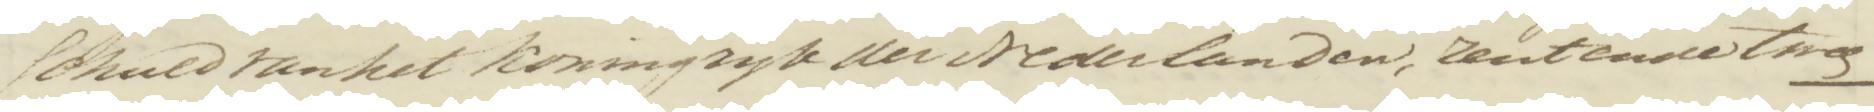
schuld van het Koningryk der Nederlanden, rentende twee
